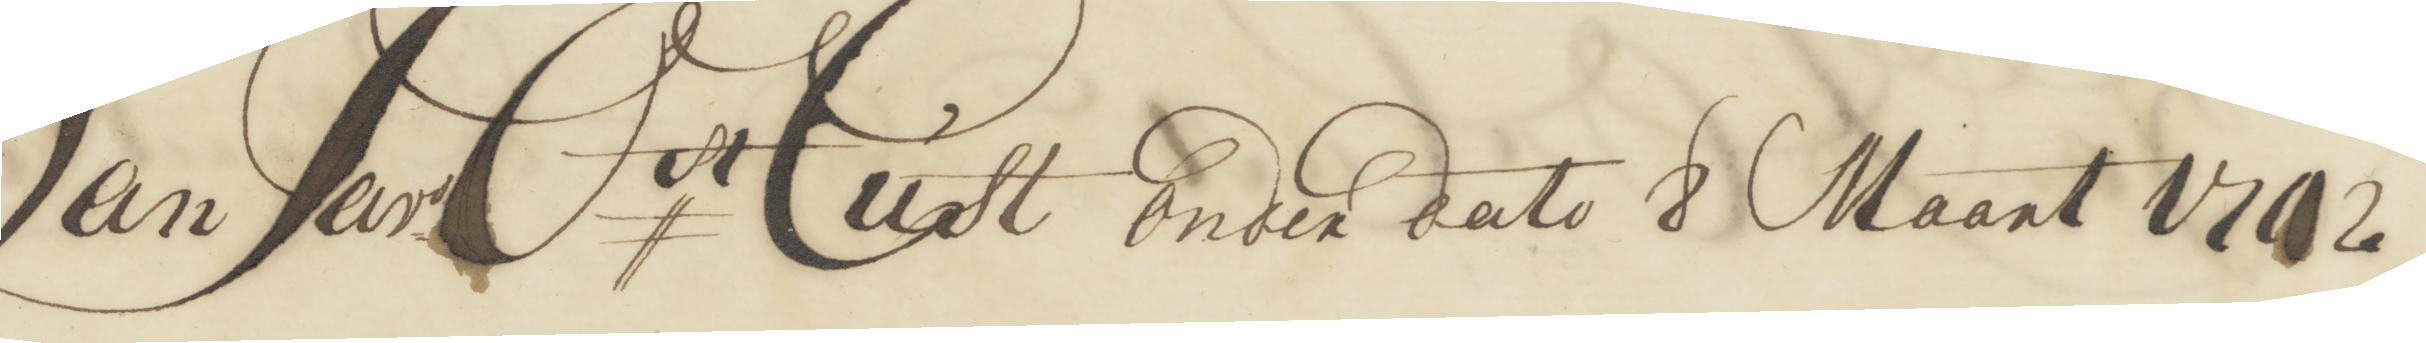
Van Jav=s O„st Cust onder dato 8 Maart 1742
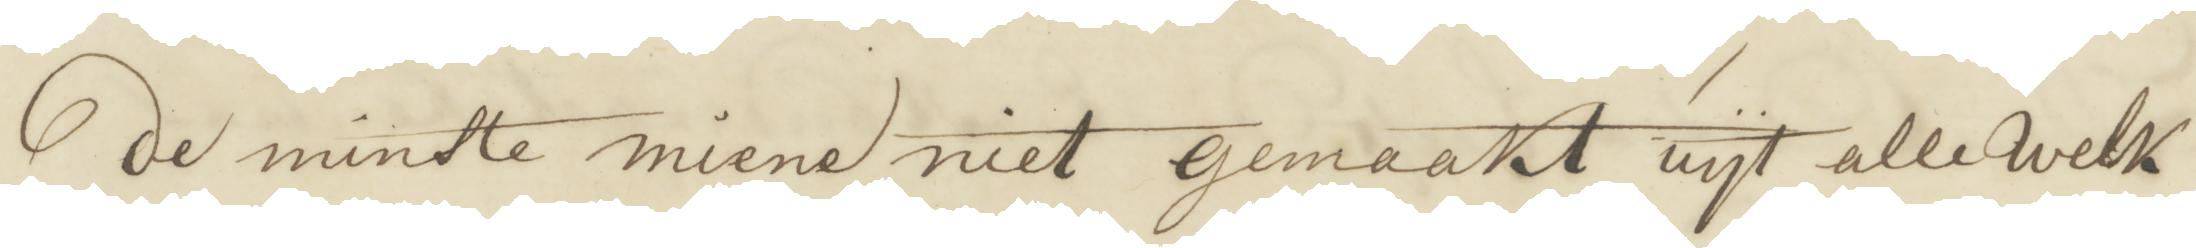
de minste miene niet gemaakt uijt alle welk
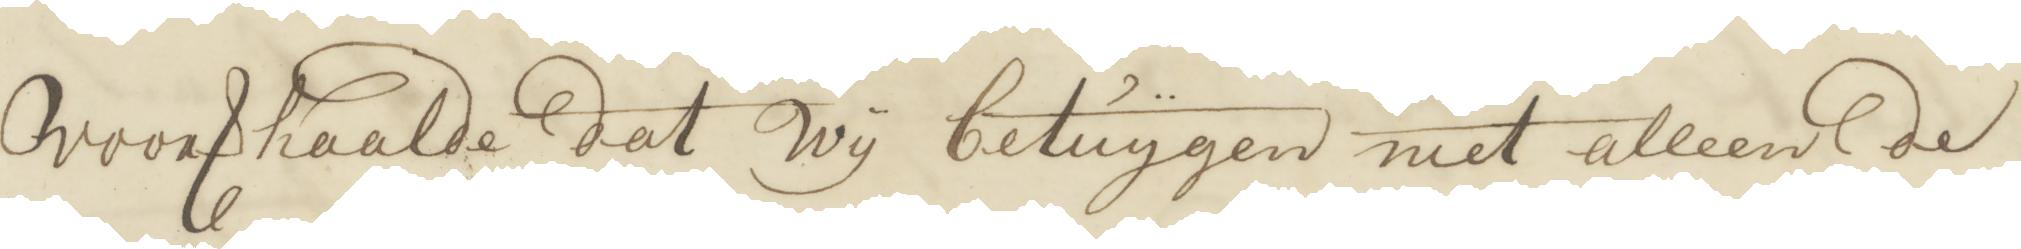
voorverhaalde dat wij betuijgen niet alleen de
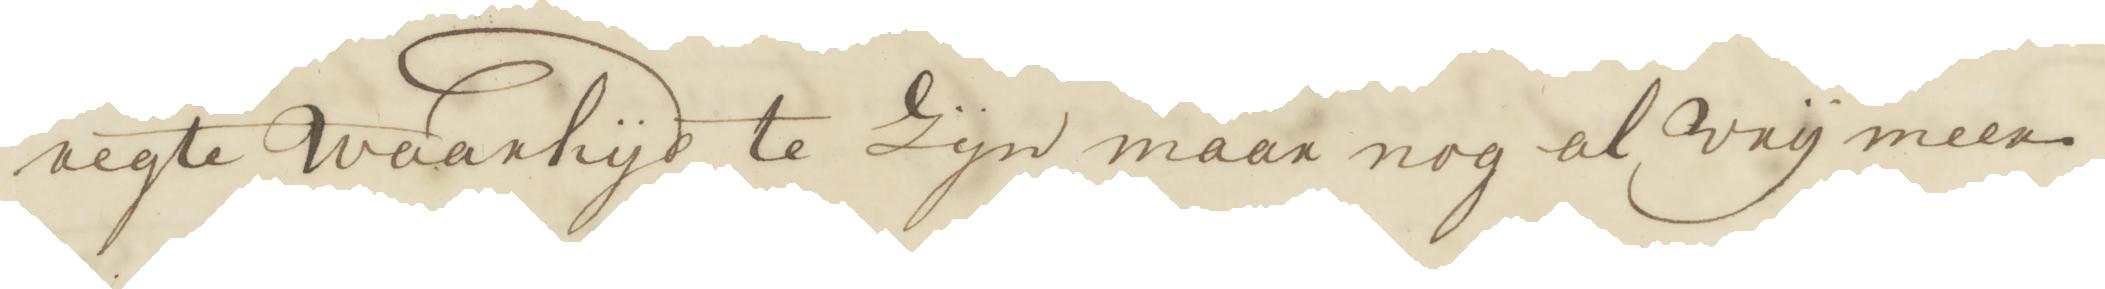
regte waarhijd te zijn maar nog al vrij meer
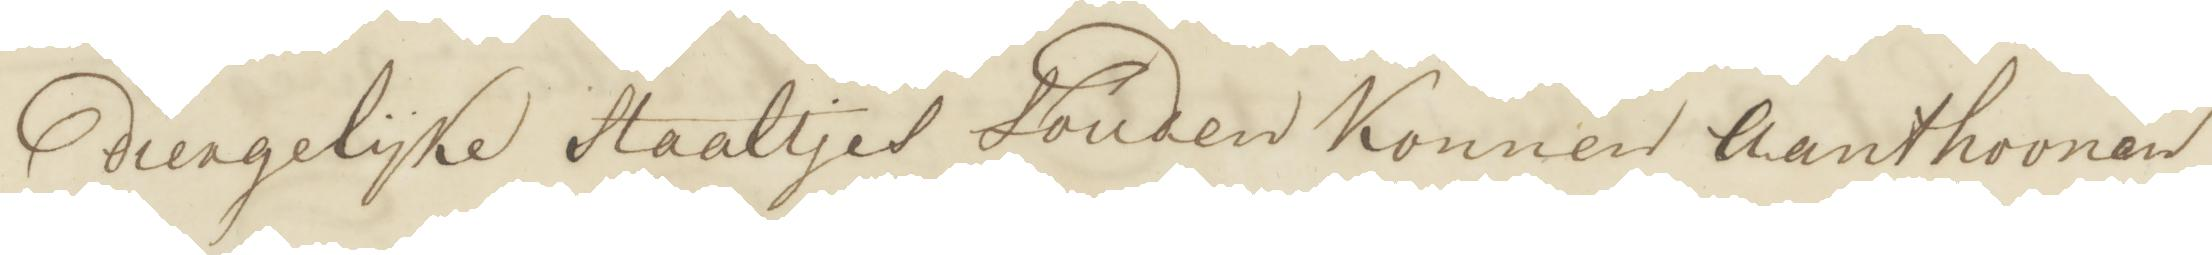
diergelijke staaltjes souden konnen aanthoonen
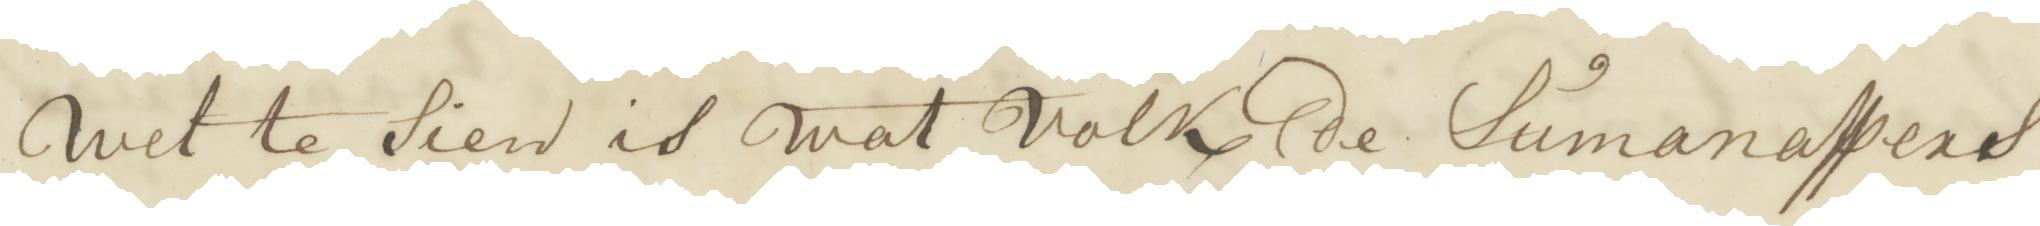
wel te sien is wat volk de Sumanappers
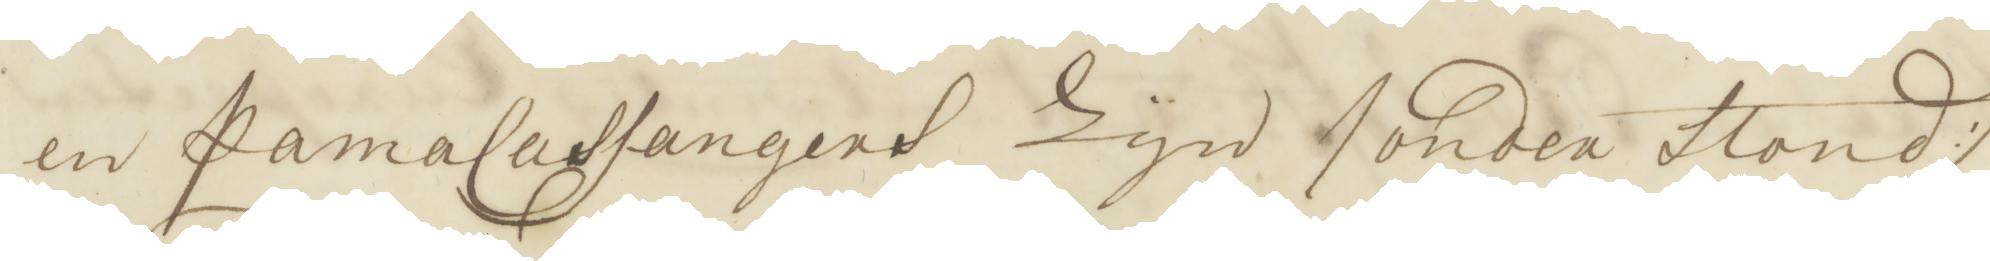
en Pamacassangers zijn /onderstond:/
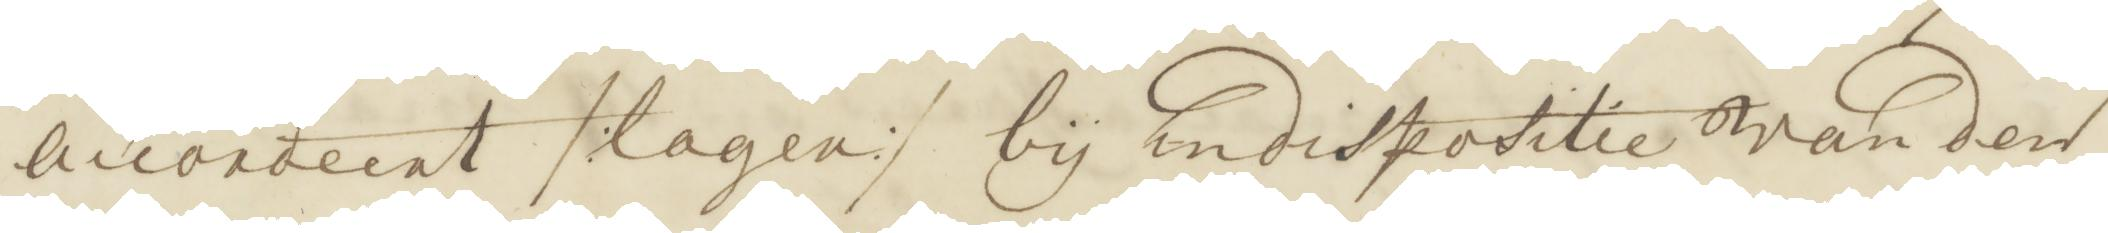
accordeert /:lager:/ bij indispositie van den
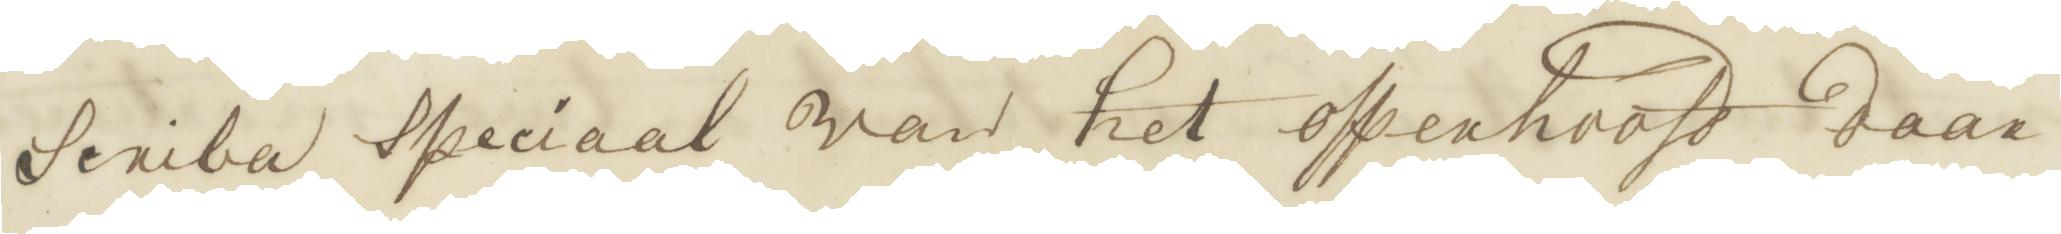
scriba speciaal van het opperhoofd daar
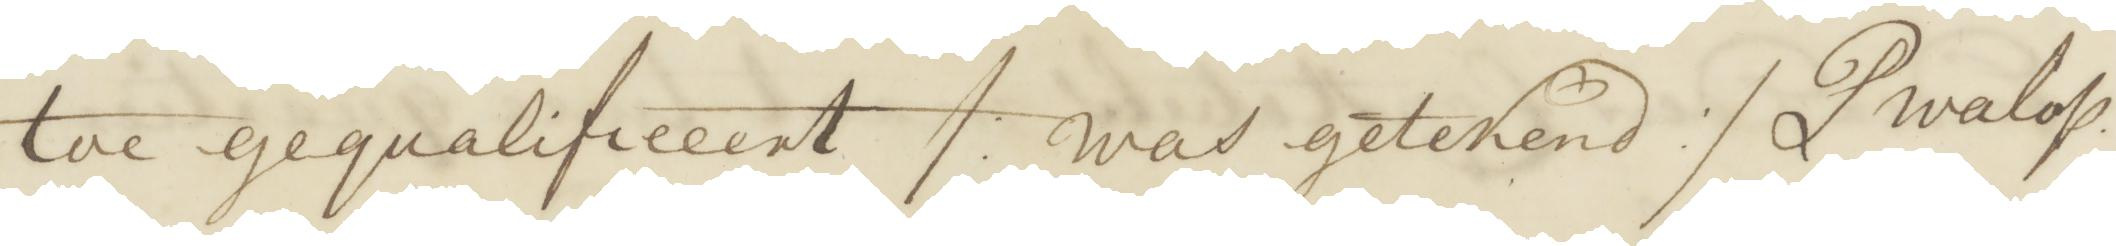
toe gequalificeert /: was getekend :/ P walop
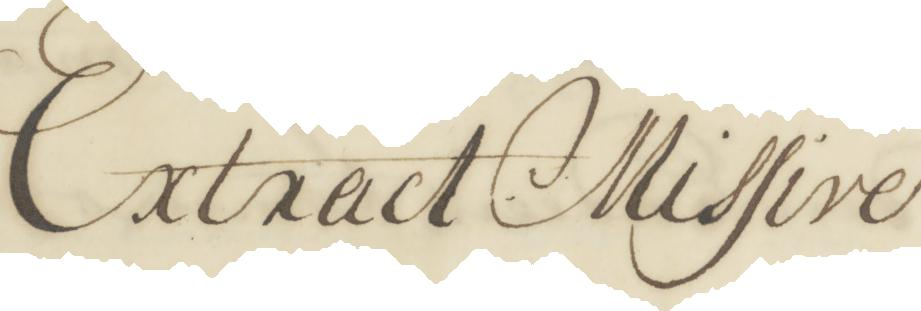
Extract Missive
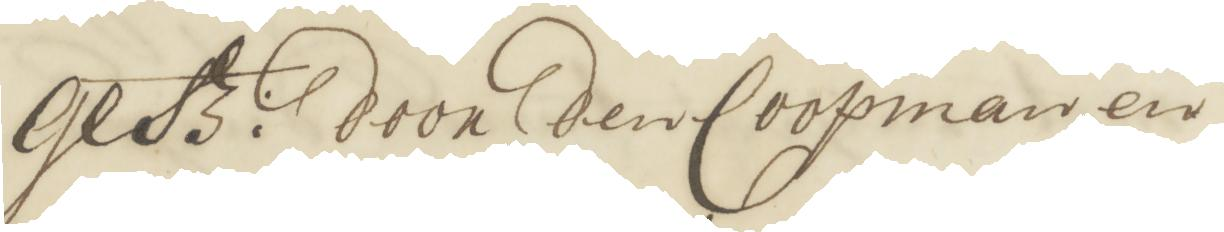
gesz: door den Coopman en
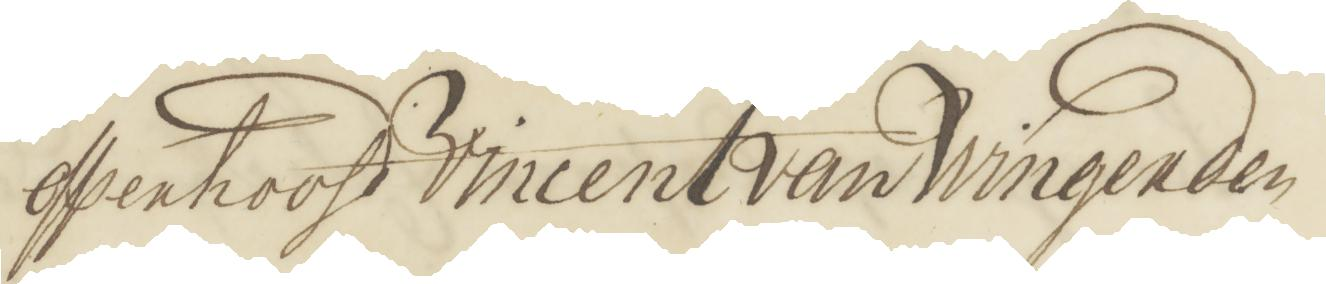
opperhoofd Vincent van Wingerden
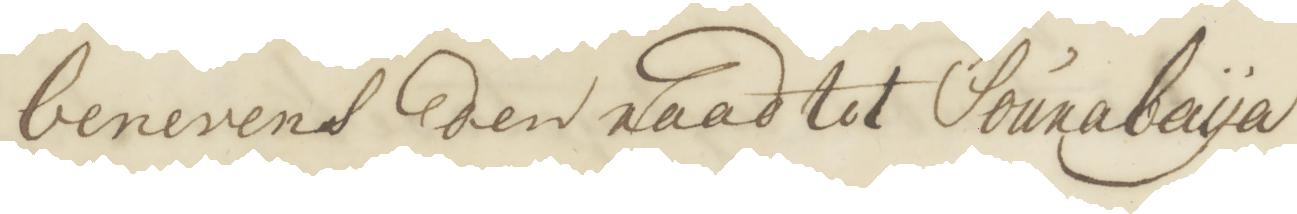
benevens den raad tot sourabaija
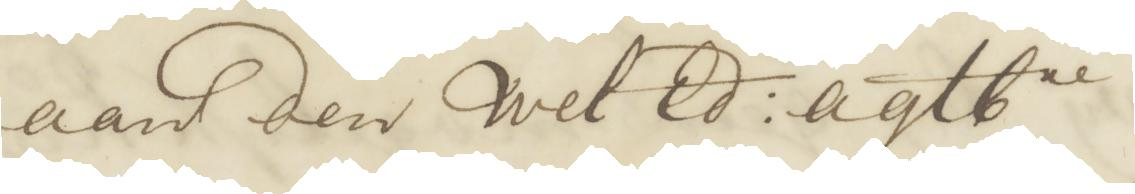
aan den wel Ed: agtbre
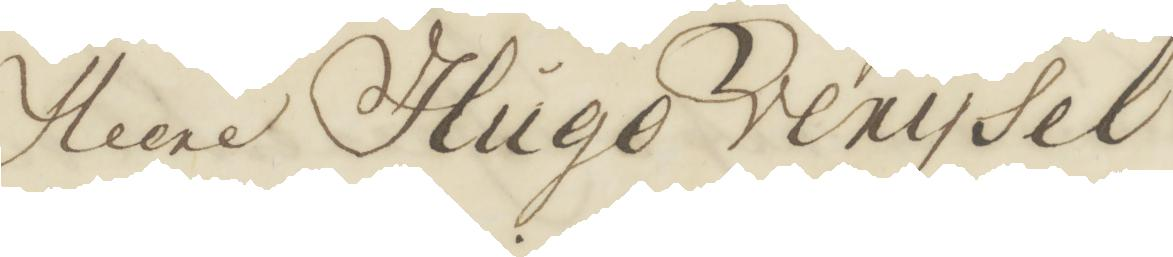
Heere Hugo Verijsel
